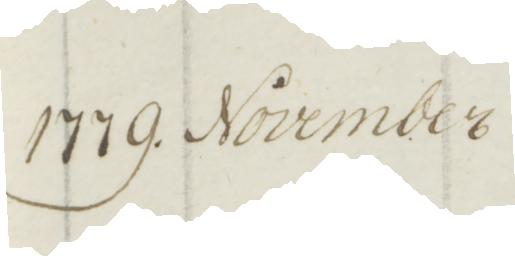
1779. November
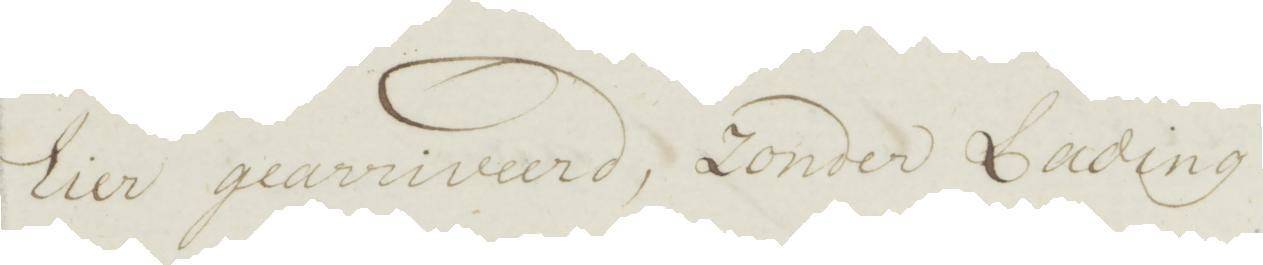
hier gearriveerd, zonder Lading
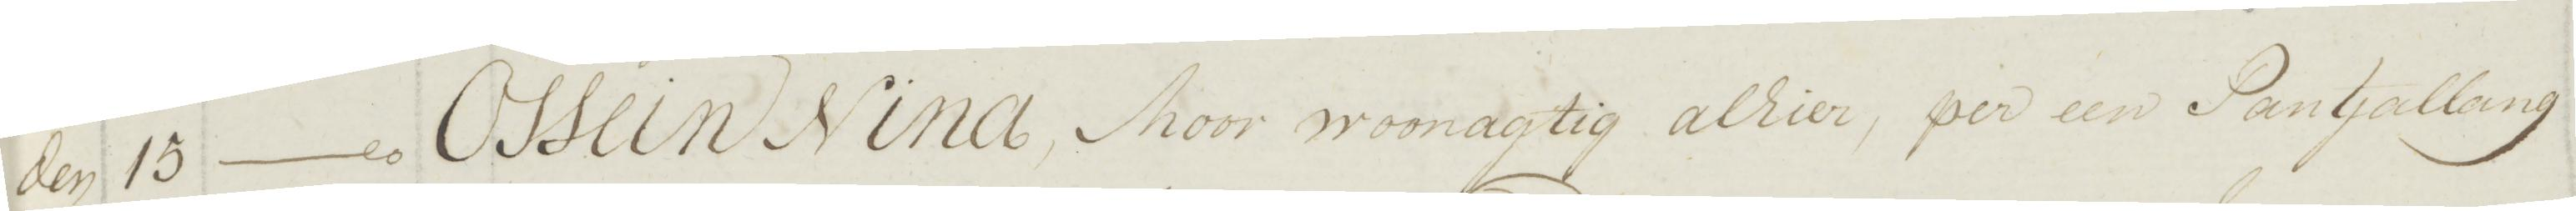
den 15 _o Ossein Nina, Moor woonagtig alhier, per een Pantjallang
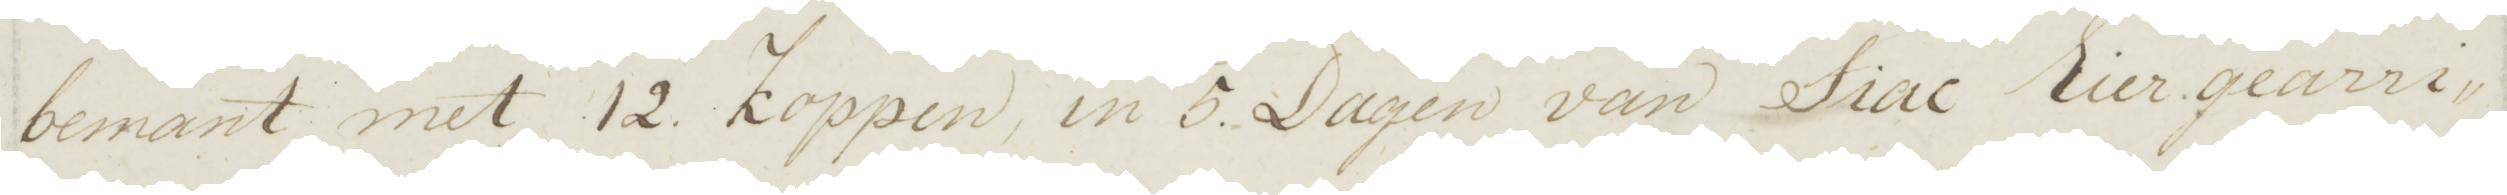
bemant met 12. koppen, in 5. Dagen van Siac hier gearri„
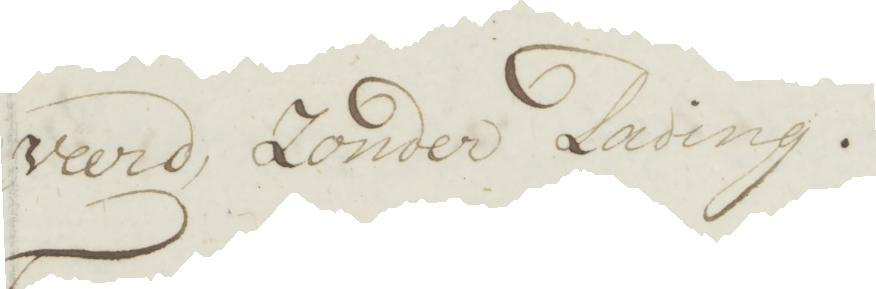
veerd, zonder Lading.
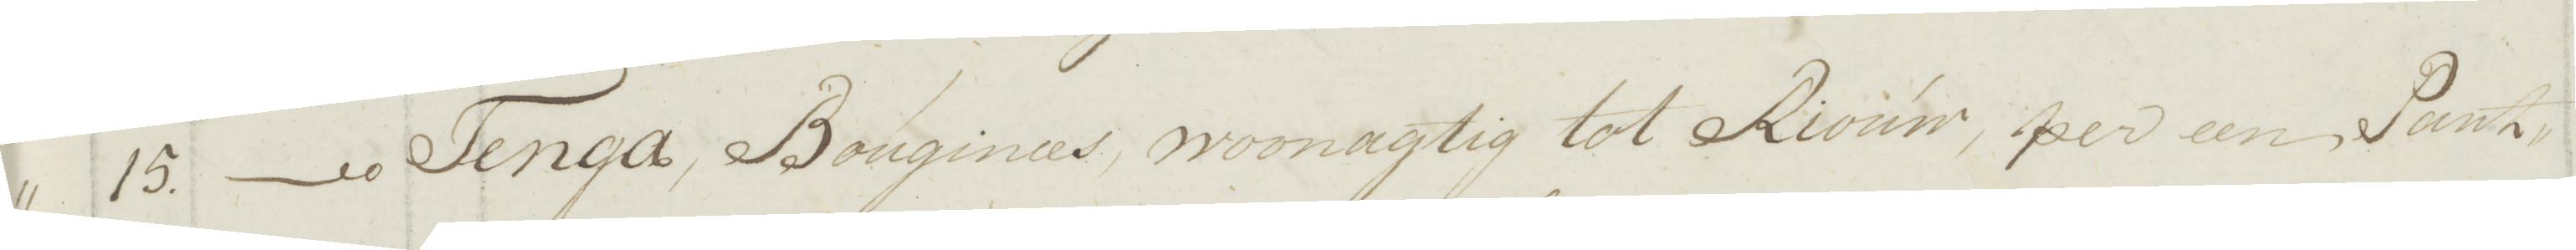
„ 15. _o Tenga, Bouginees, woonagtig tot Riouw, per een Pant„
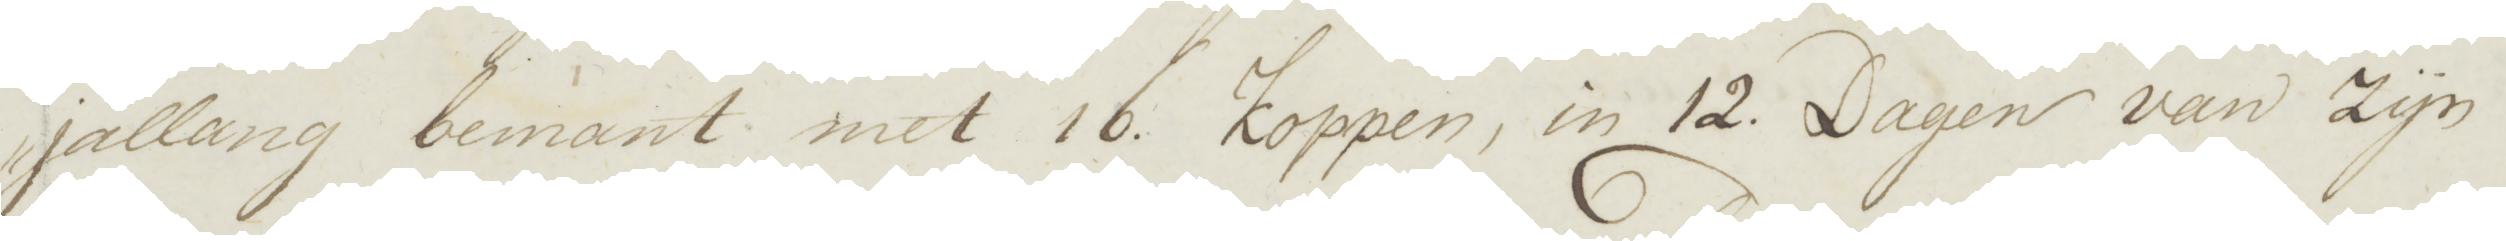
„jallang bemant met 16. koppen, in 12. Dagen van zijn
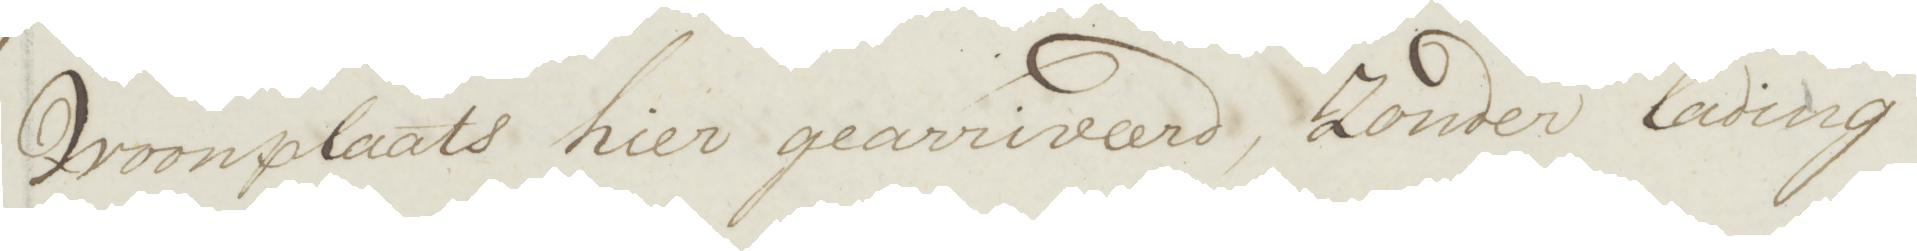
woonplaats hier gearriveerd, zonder lading
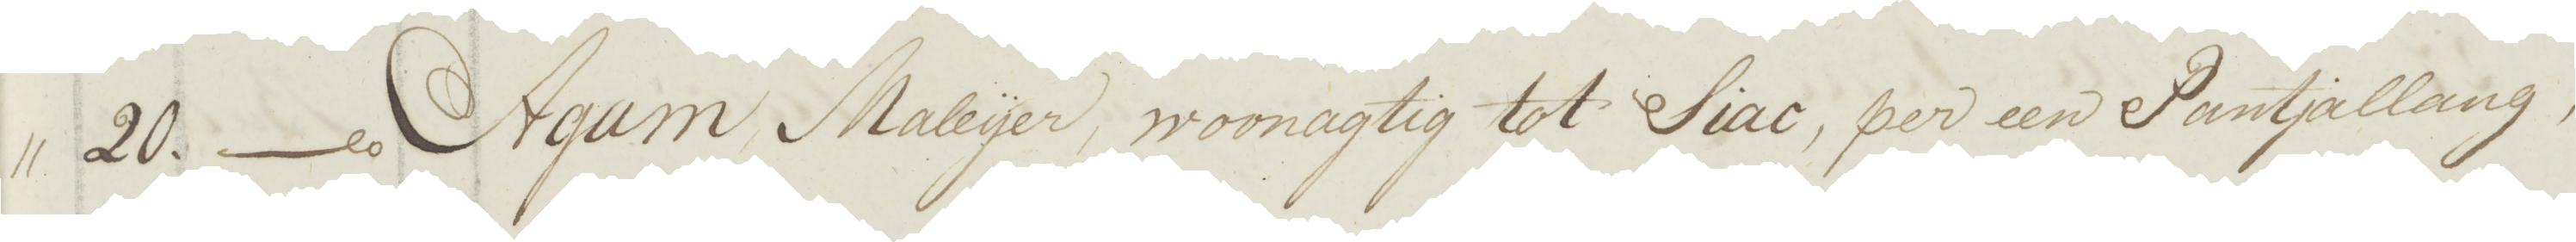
„ 20. _o Agam Maleijer, woonagtig tot Siac, per een Pantjallang,
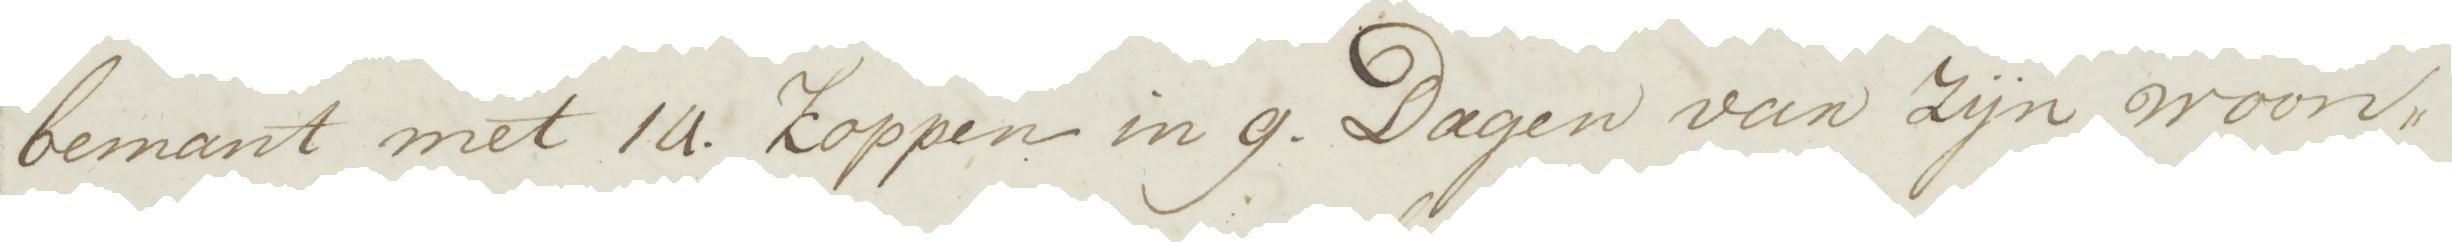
bemant met 14. koppen in 9. Dagen van zijn woon„
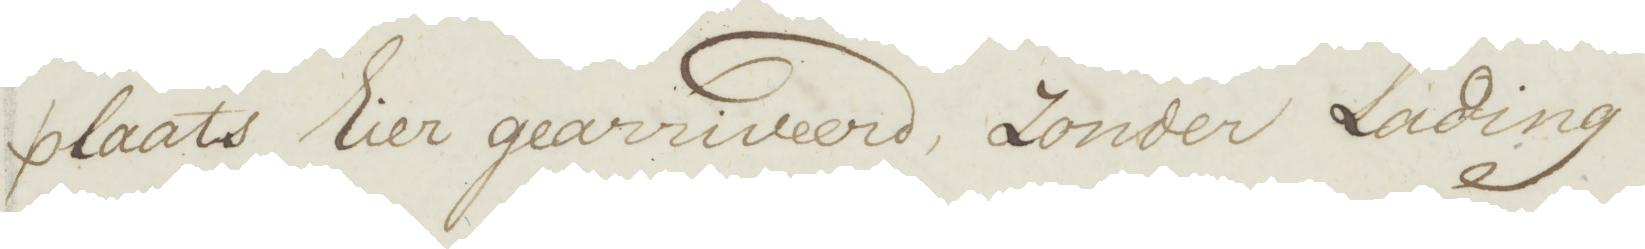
plaats hier gearriveerd, zonder Lading
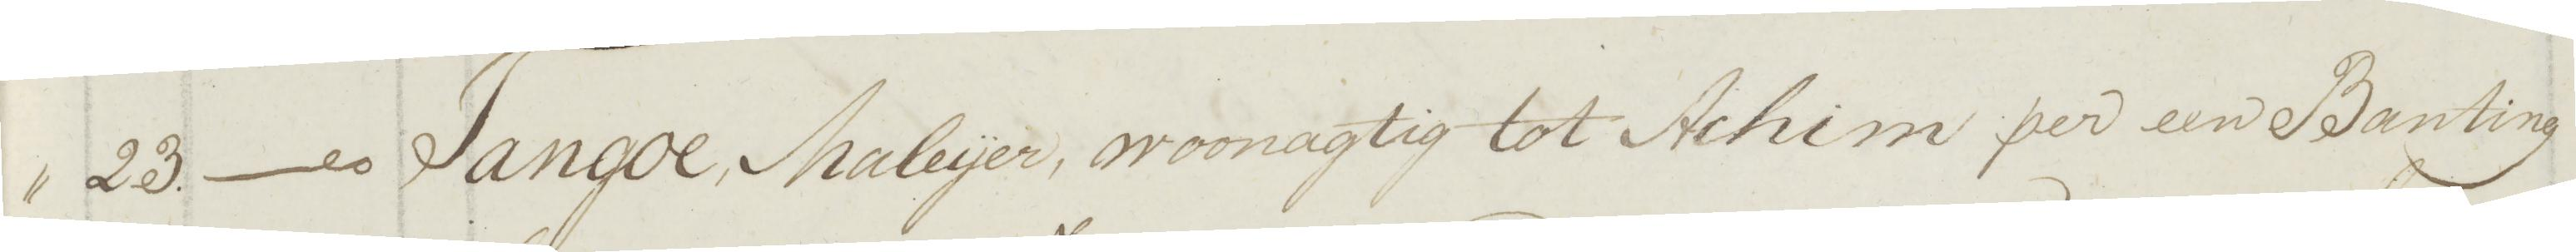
„ 23. _o Tangoe, Maleijer, woonagtig tot Achim per een Banting
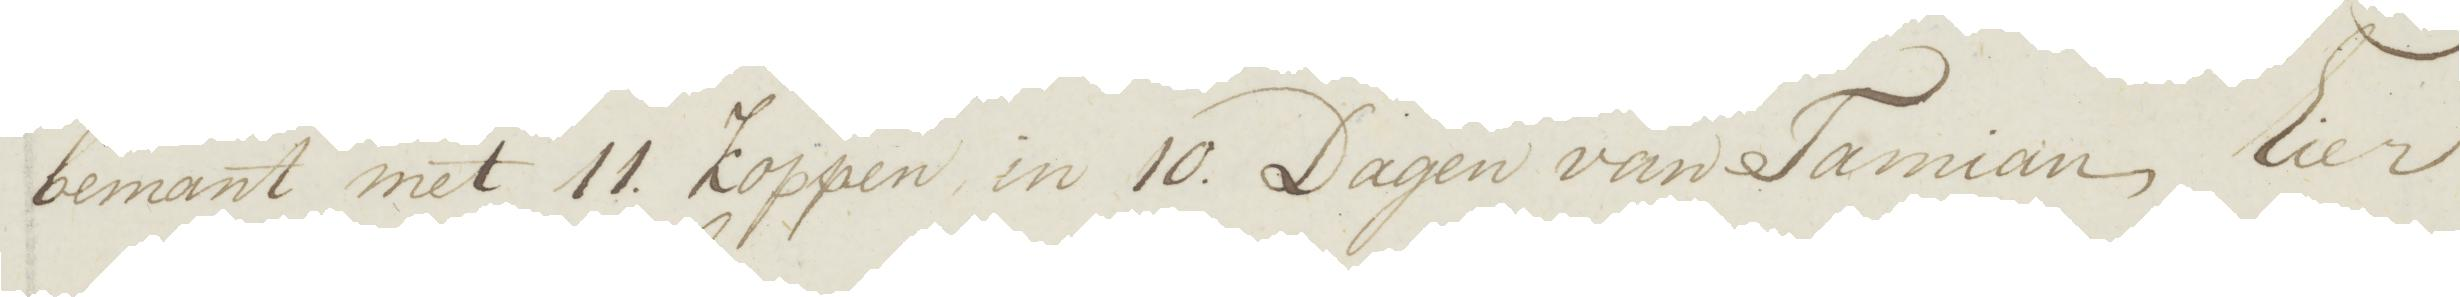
bemant met 11. koppen in 10. Dagen van Tamian hier
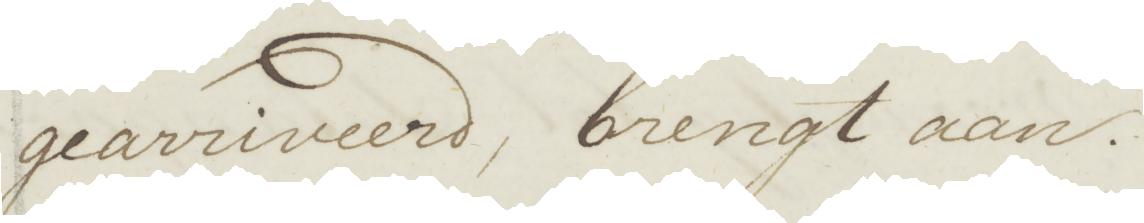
gearriveerd, brengt aan.
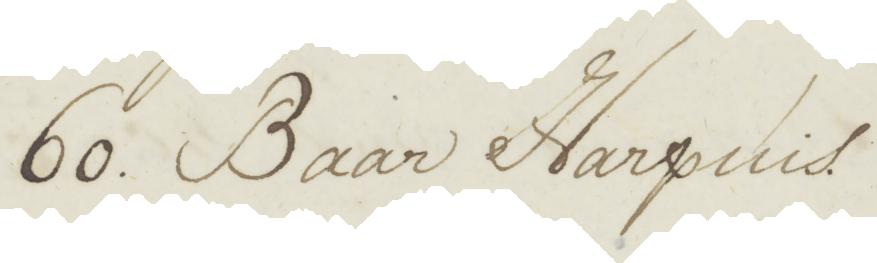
60. Baar Harpuis.
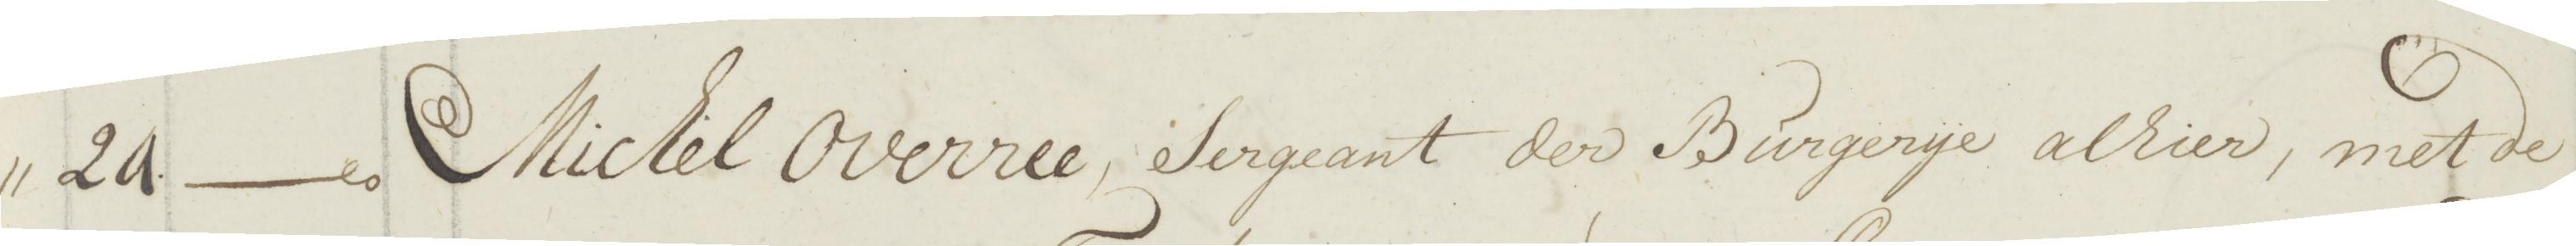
„ 24. _o Michel Overree, sergeant der Burgerije alhier, met de
